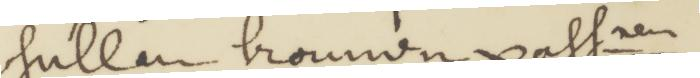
sullen konnen pass=ren
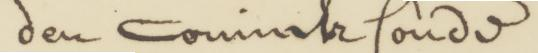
den Coninck soude
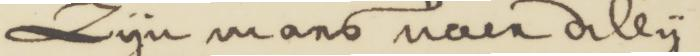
zijn mars naer dillij
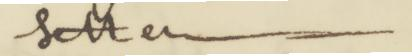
setten
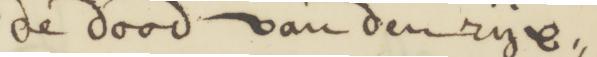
de dood van den rijx„
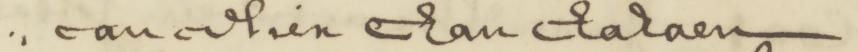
„cancelier chan chahaen
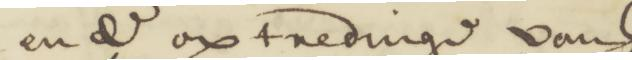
en de optredinge van
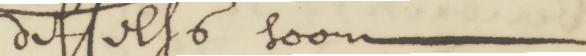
desselfs soon
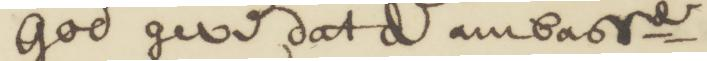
god geve, dat de ambass=de
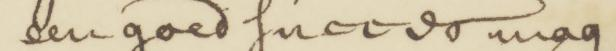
een goed succes mag
